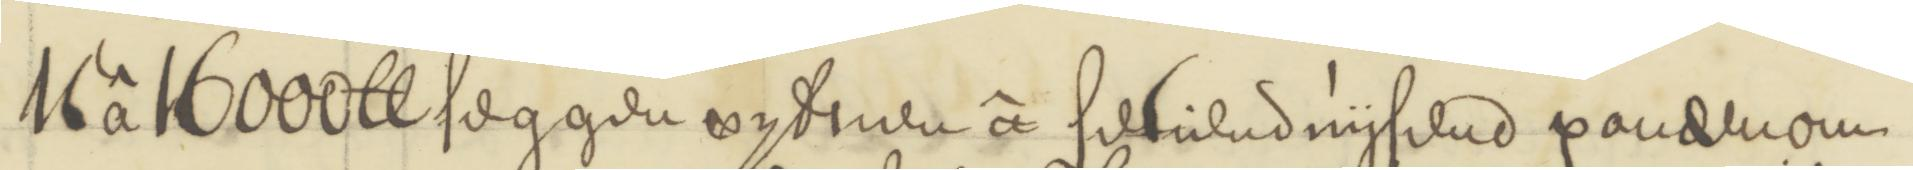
borax . . . . . . 15 â 16000 lb seggen vijftien â setienduijsend ponden om
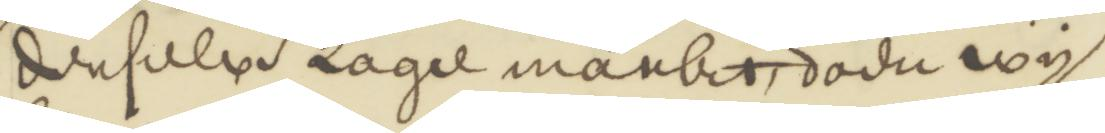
derselve lage markt, doen wij
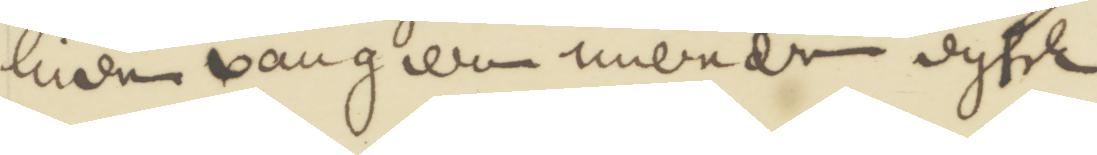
hier van geen meerder eijsch
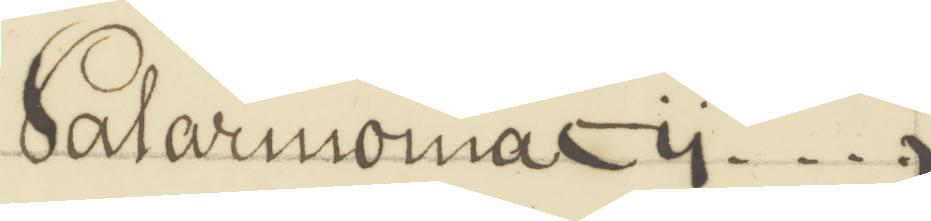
Salarmoniacij . . . .
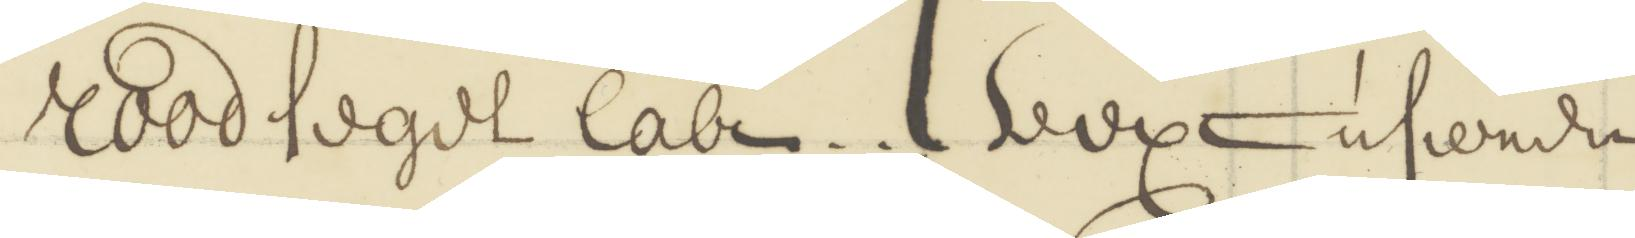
roodsegel lak . . te excuseeren
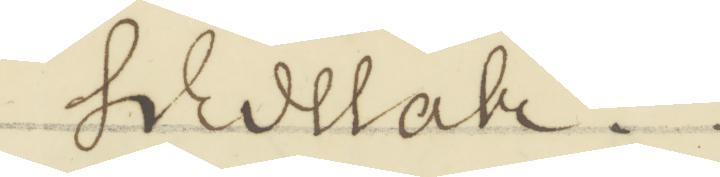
schellak . . . .
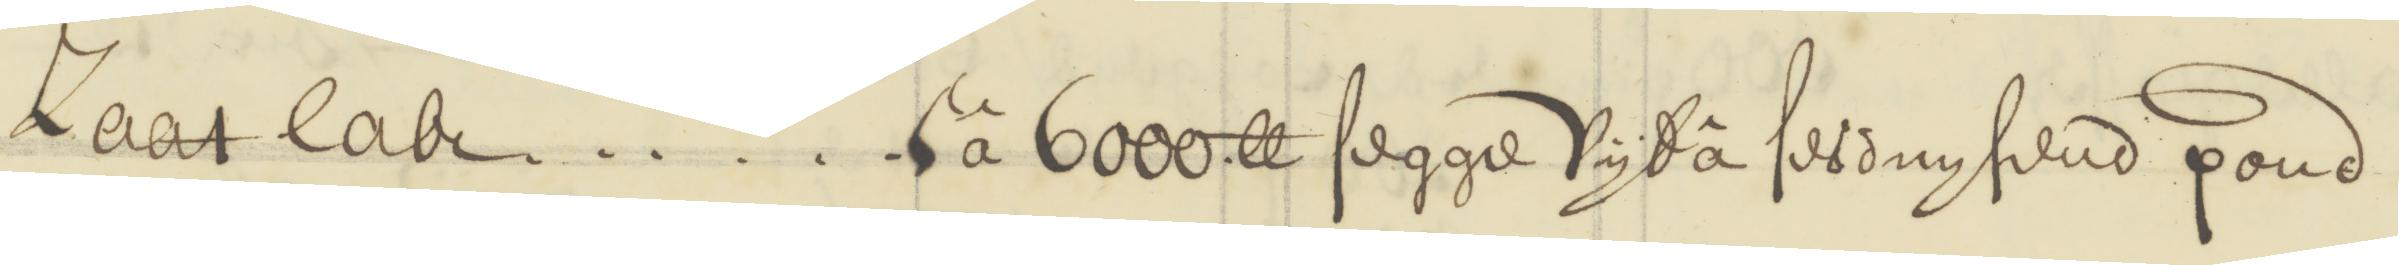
zaat lak . . . . . . 5 â 6000. lb segge vijf â sesduysend pond
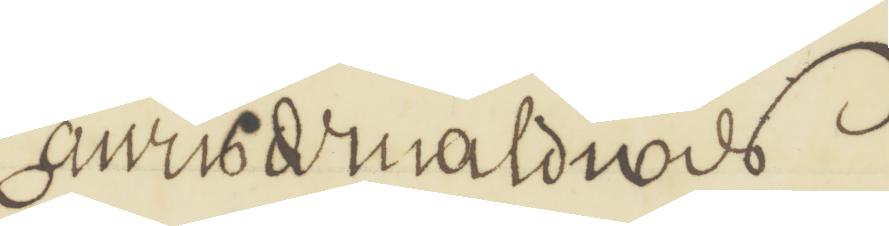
Cauris de maldives
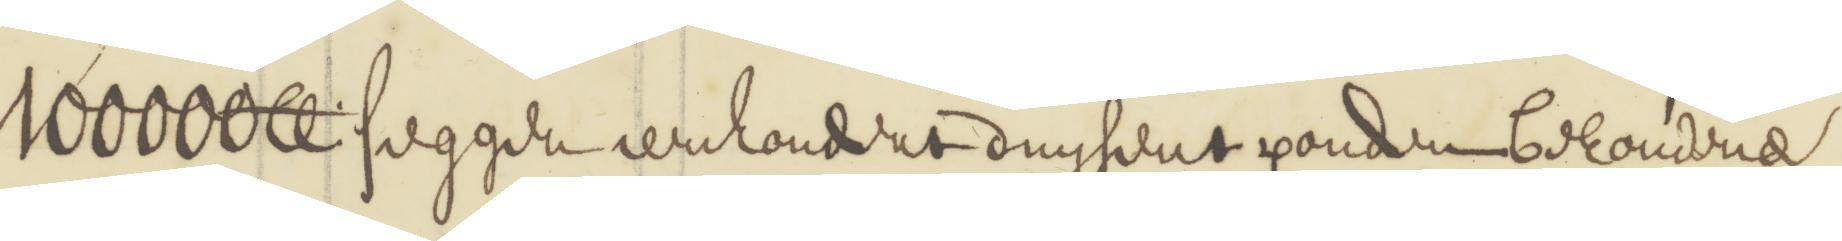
100000 lb: seggen eenhondert duysent ponden behoudende
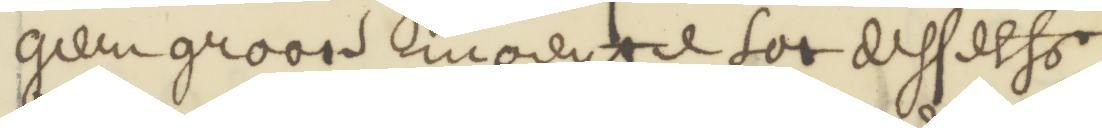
geen groote moeyte tot desselfs
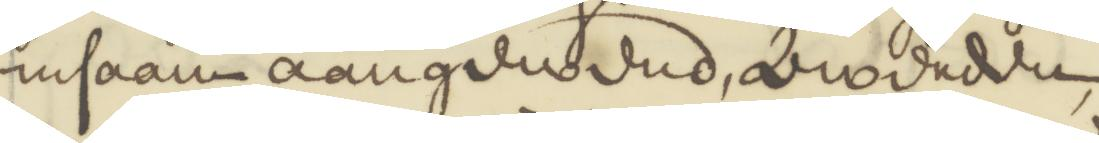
insaam aangewend, te werden,
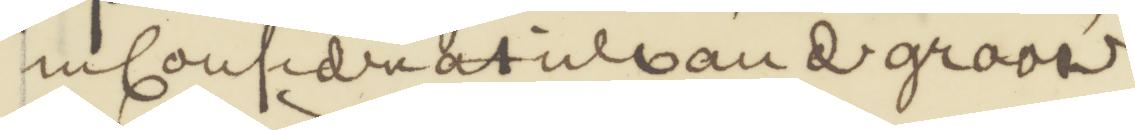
in Consideratie van de groote
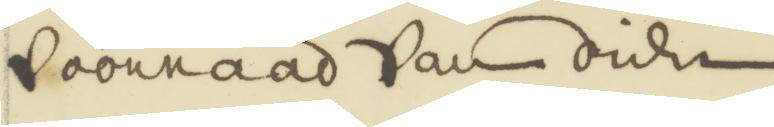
voorraad van dien
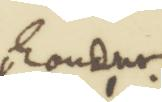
„hondert
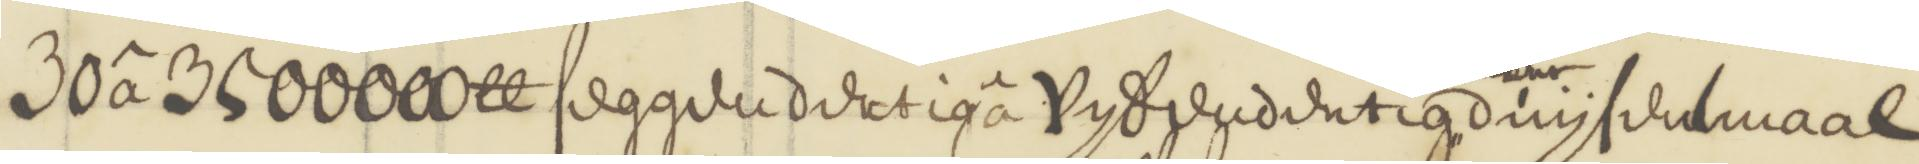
30 â 3500000 lb seggen dertig â Vyfendertig „ duijsentmaal
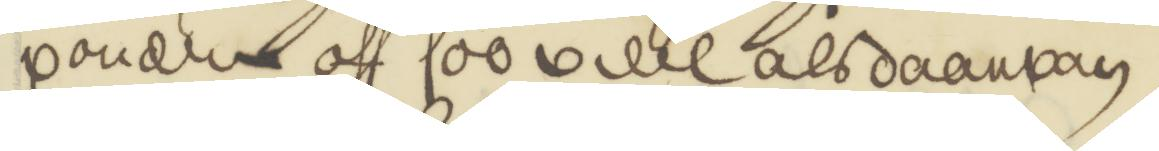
ponden off soo veel als daarvan
